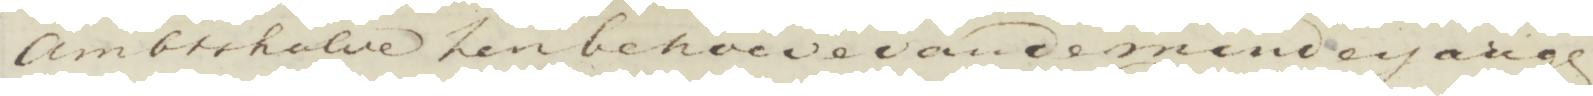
Ambtshalve ten behoeve van de minderjarige
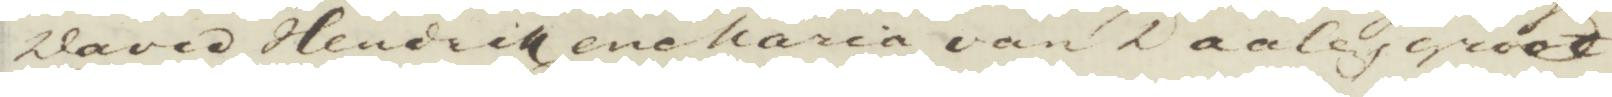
David Hendrik en Maria van Daale, groot
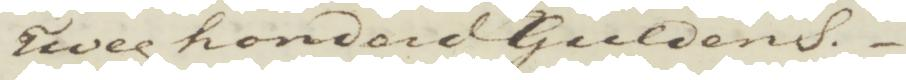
twee honderd Guldens. –
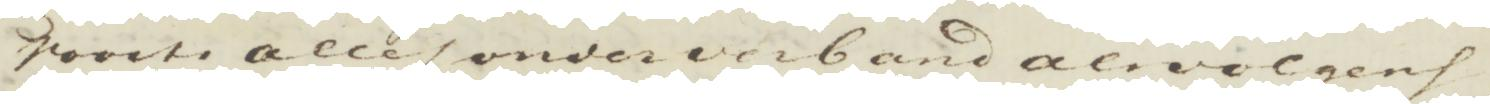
voorts alle sonder verband als volgens
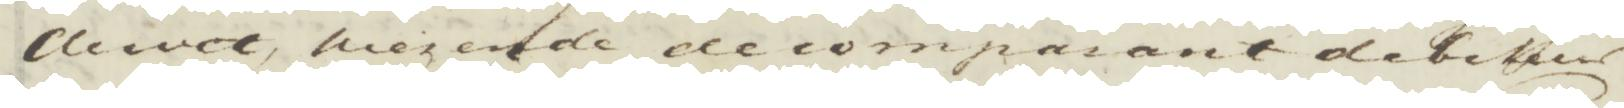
de wet, wezende de comparant debiteur
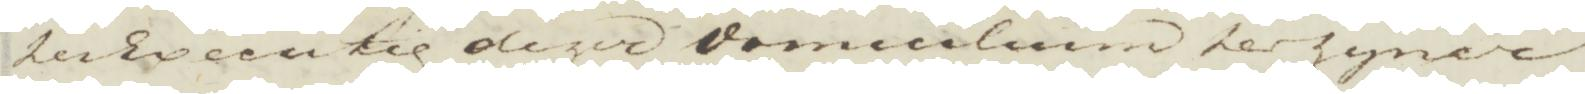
ter Executie dezer domicilium te zyner
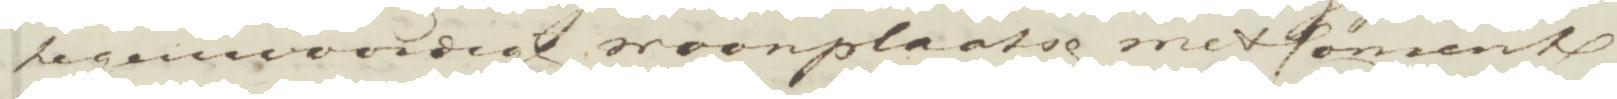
tegenwoordige woonplaatse met Consent
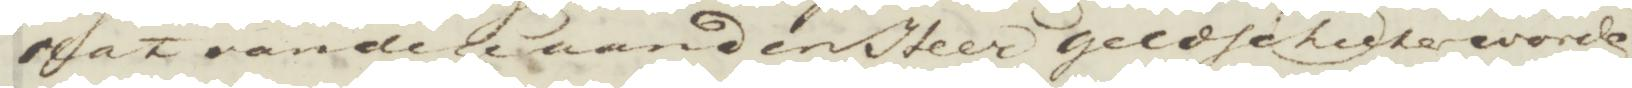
dat van deze aan den Heer geldschieter worde
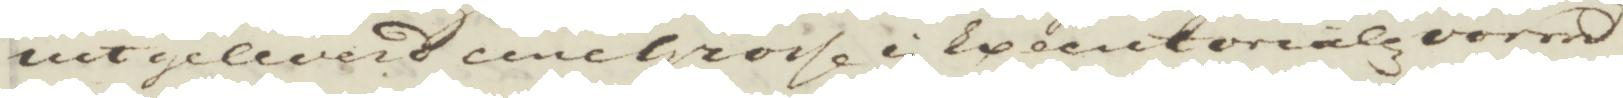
uit geleverd eene Grosse in Executorialen vorm
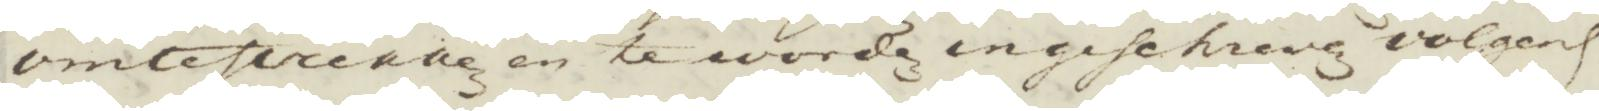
omtestrekken en te worden ingeschreven volgens
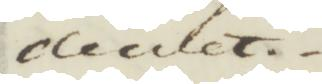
de wet. -
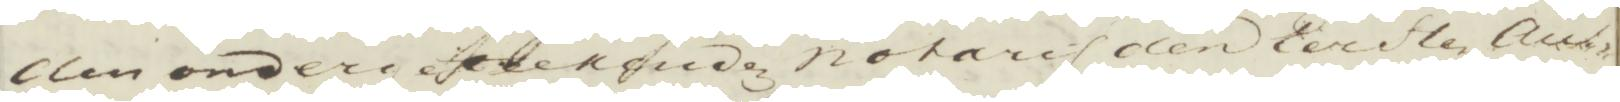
den ondergeteekende notaris den Eerste Au„
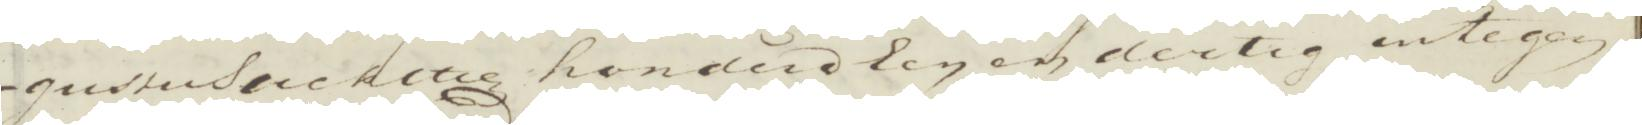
gustus achttien honderd Een en dertig integen
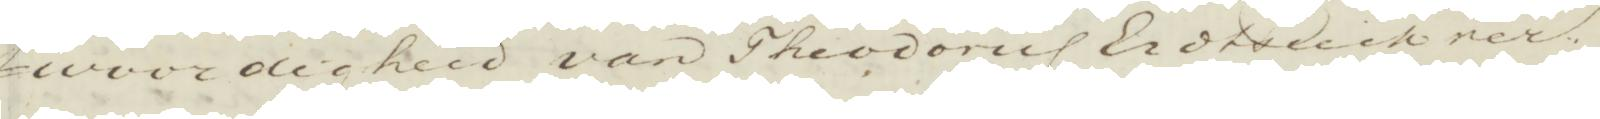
=woordigheid van Theodorus Erdtsieck ver„
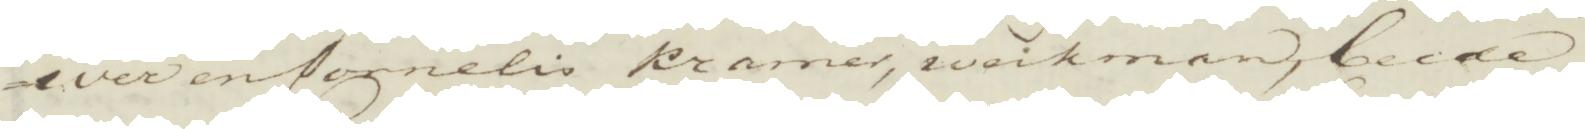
=wer en Cornelis kramer, werkman beide
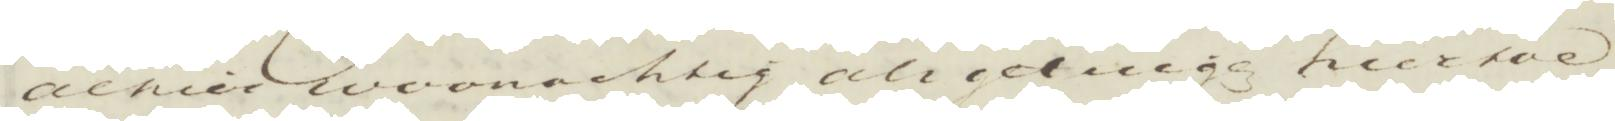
alhier woonachtig als getuige hiertoe
